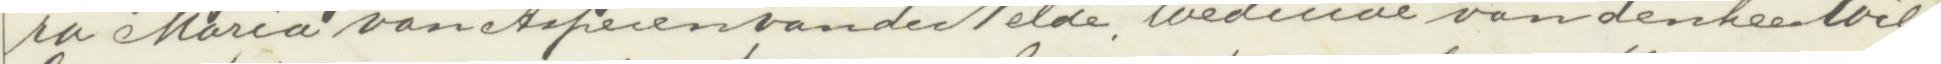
ra Maria van Asperen van der Velde, weduwe van den heer Wil
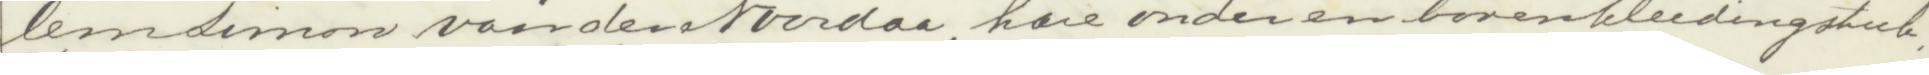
lem Simon van der Noordaa, hare onder en bovenkleedingstuk,
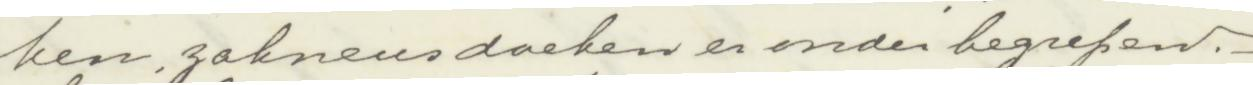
ken, zakneusdoeken er onder begrepen.
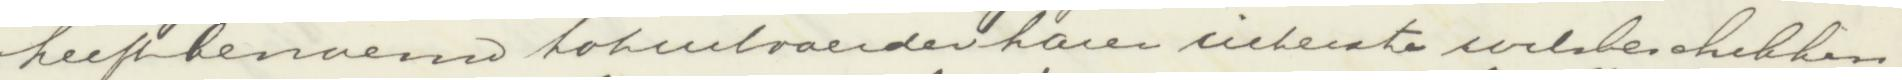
heeft benoemd tot uitvoerder harer uiterste wilsbeschikkin.
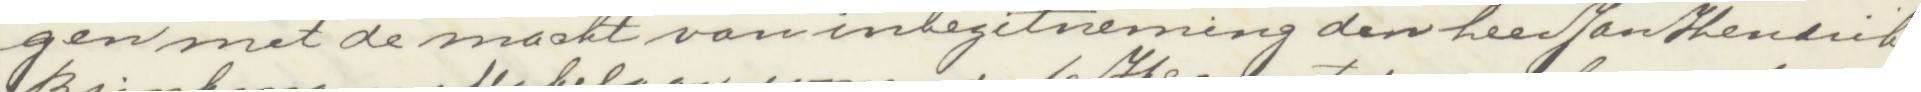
gen met de macht van inbezitneming den heer Jan Hendrik
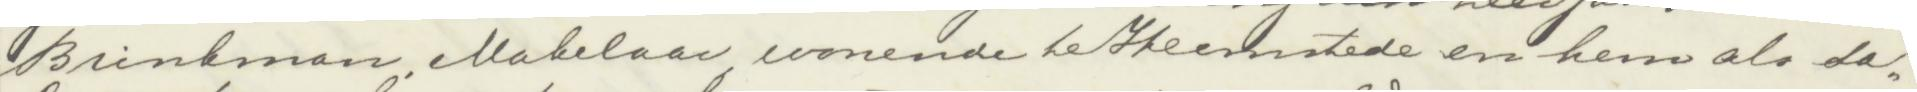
Brinkman, Makelaar wonende te Heemstede en hem als sa„
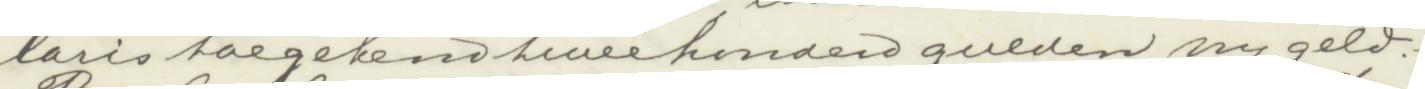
laris toegekend tweehonderd gulden, vry geld.
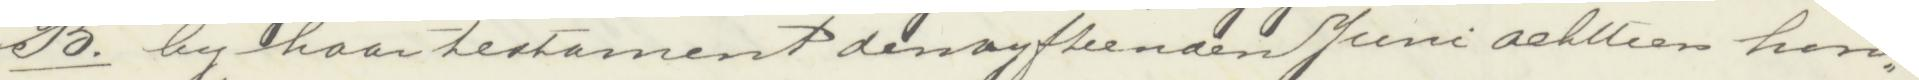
B. by haar testament den vyftienden Juni achttien hon„
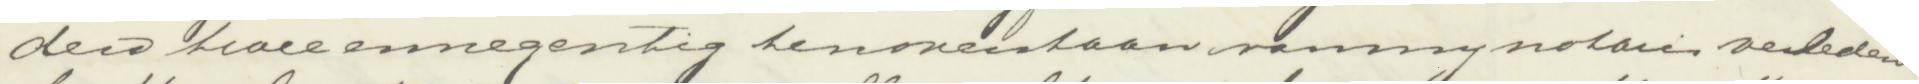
derd twee ennegentig ten overstaan van my notaris verleden
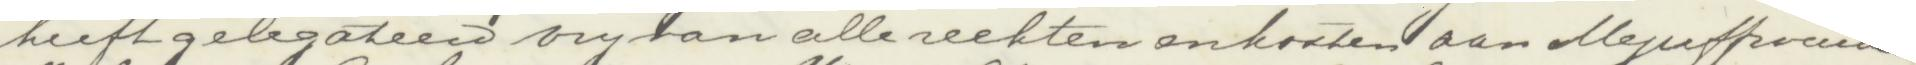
heeft gelegateerd vry van alle rechten en kosten aan Mejuffrouwen
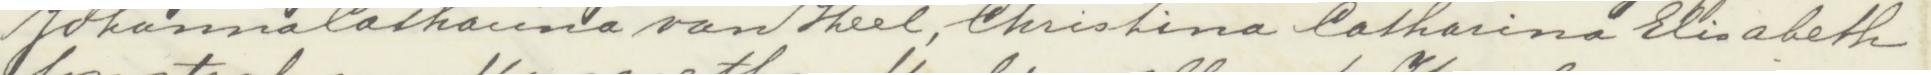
Johanna Catharina van Heel, Christina Catharina Elisabeth
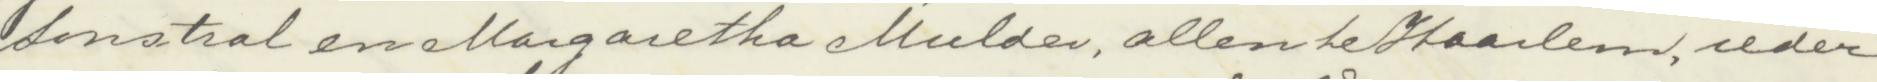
Sonstral en Margaretha Mulder, allen te Haarlem, ieder
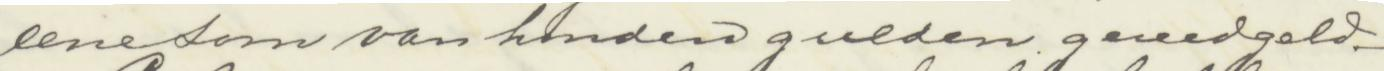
eene som van honderd gulden gereed geld.
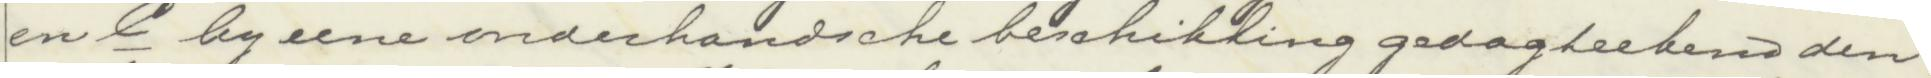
en C by eene onderhandsche beschikking gedagteekend den
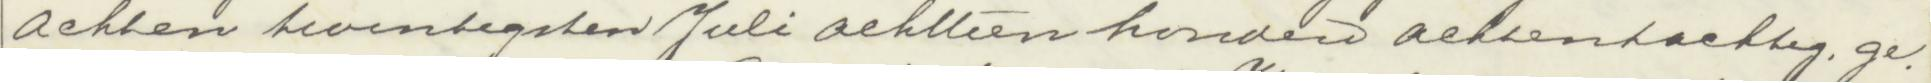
acht en twintigsten Juli achttien honderd achtentachtig, ge.
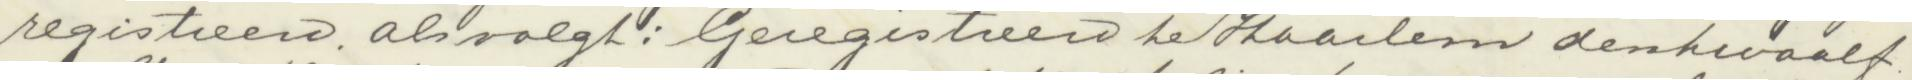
registreerd, als volgt: Geregistreerd te Haarlem den twaalf.
